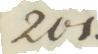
201.
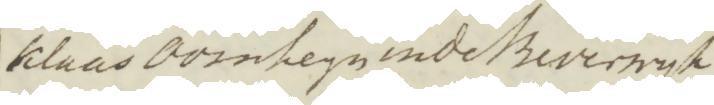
klaas Oornheyn in de Beverwyk
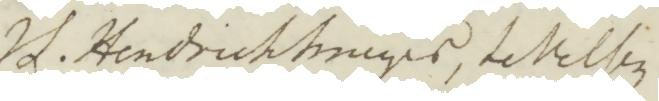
JL. Hendricksmeyer, te Velsen
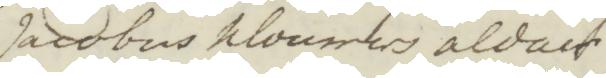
Jacobus klouwers aldaar
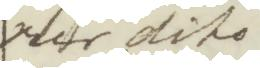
vier dito
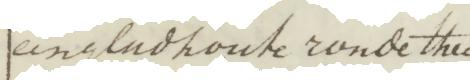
een glad houte ronde thee
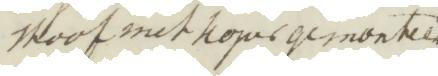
stoof met koper gemonteerd
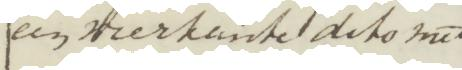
een vierkante dito met
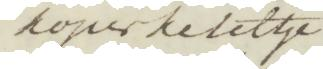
koper keteltje
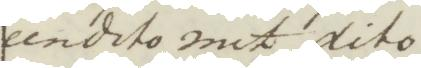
een dito met dito
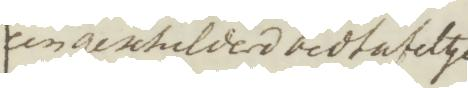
een geschilderd bedtateltje
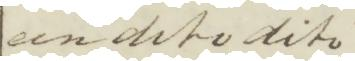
een dito dito
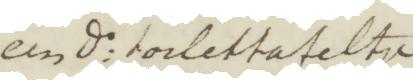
een d:o toilettafeltje
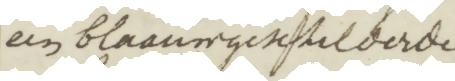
een blaauwgeschilderde
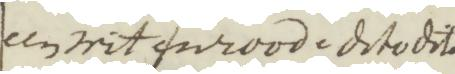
een wit en roode dito dito
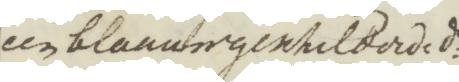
een blaauwgeschilderde d:o
